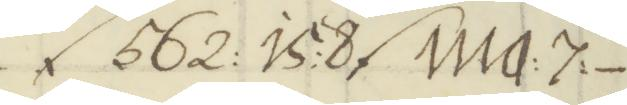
ƒ 562: 15:8 ƒ1114:7:—
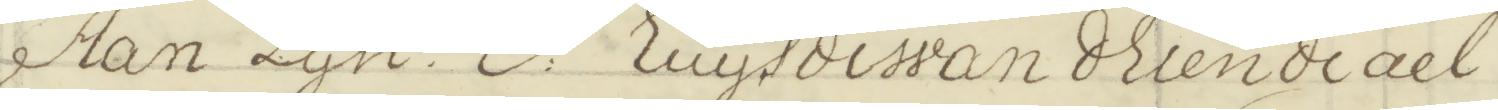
Aan zijn E:s huijsdiwan dhiendiael
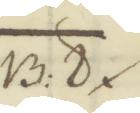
13: 8ƒ
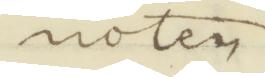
2 „ noten
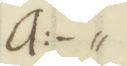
4: - „
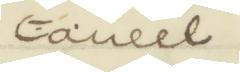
2 „ caneel
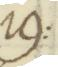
6: 19
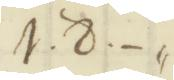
1. 8. – „
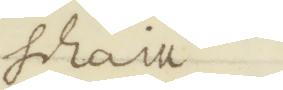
schair
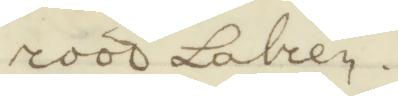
rood laken .
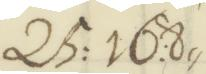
25: 16:8„
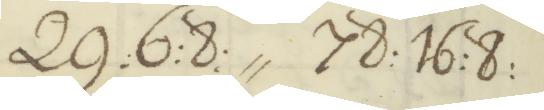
29:6:8: „ 78:16:8:
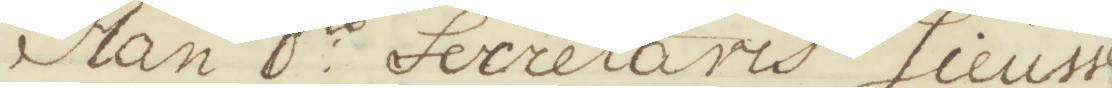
Aan d:ts Secretaris Lieuw
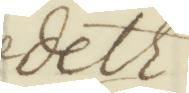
deth
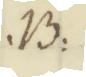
ƒ — . 13:
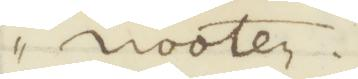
2: „ nooten.
